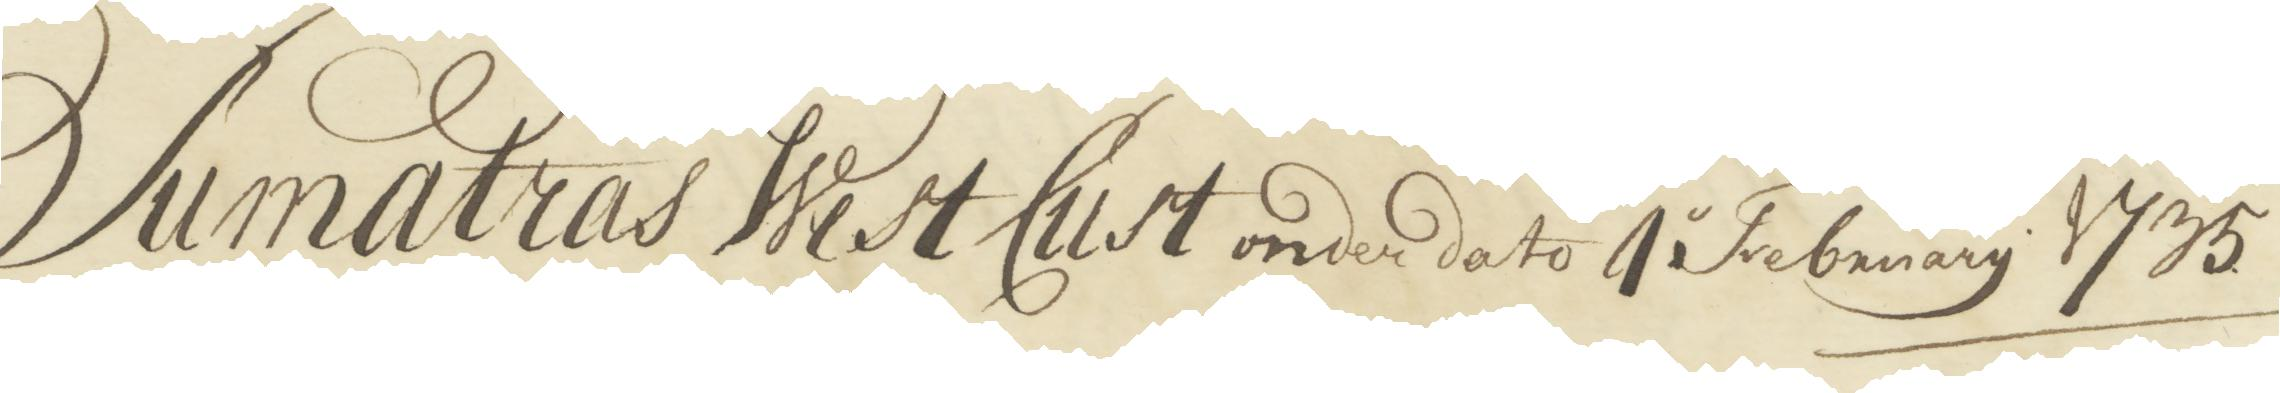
Sumatras West Cust onder dato 4:' Februarij 1735.
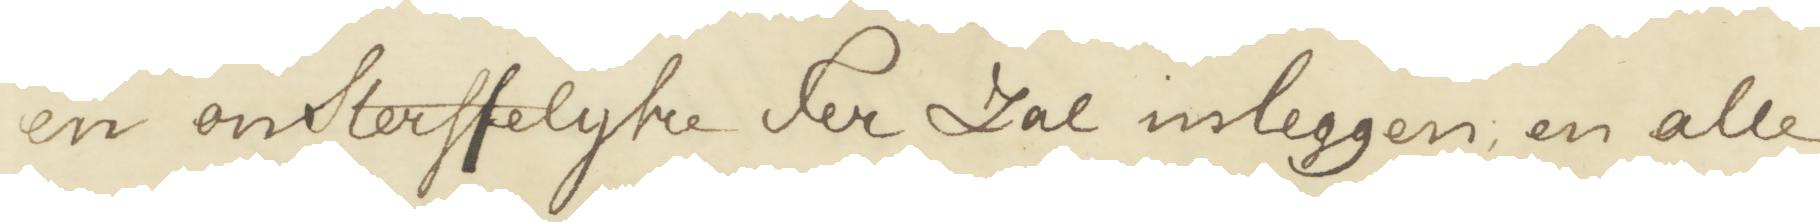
en onsterffelijke Eer zal inleggen; en alle
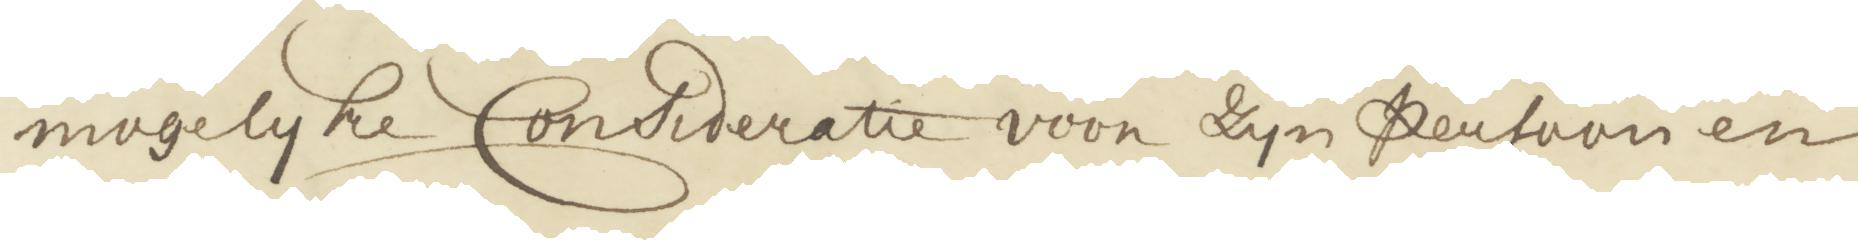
mogelyke Consideratie voor zyn persoon en
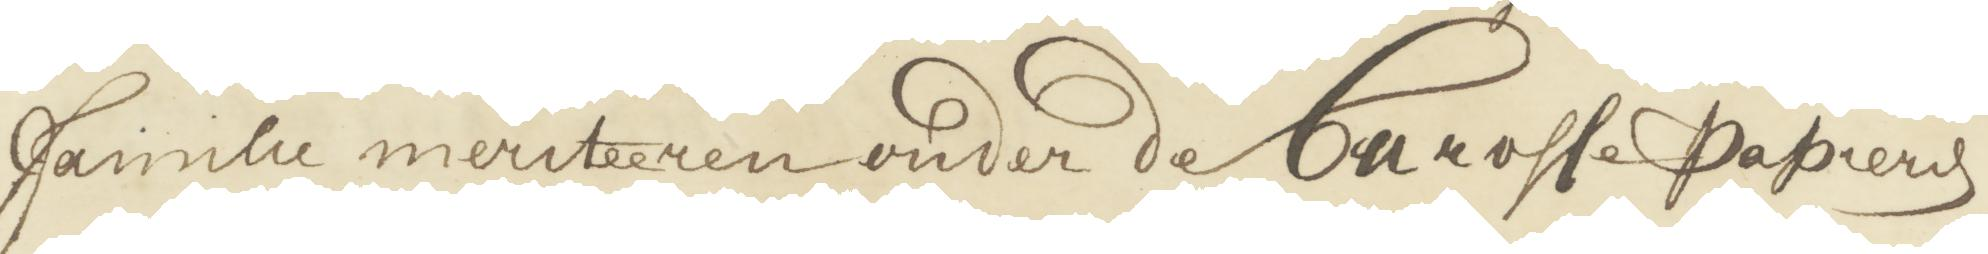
familie meriteeren onder de Barosse papieren
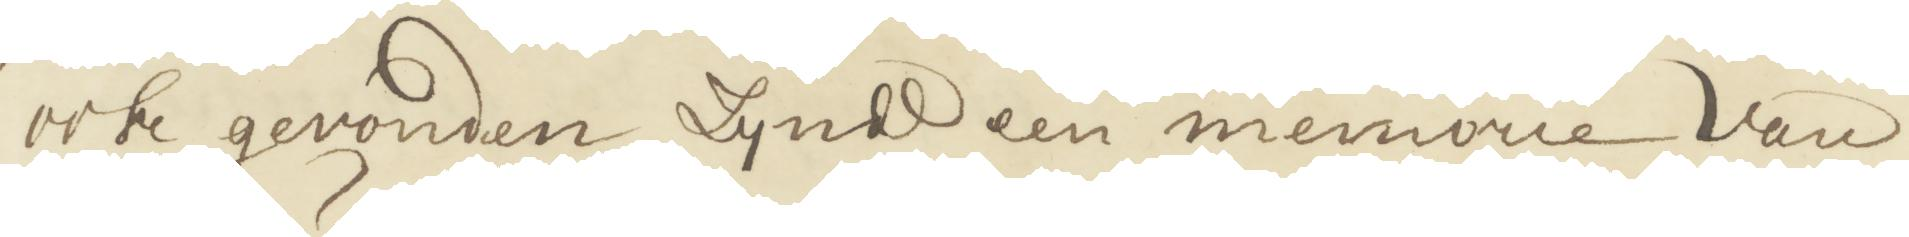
ook gevonden zynde een memorie van
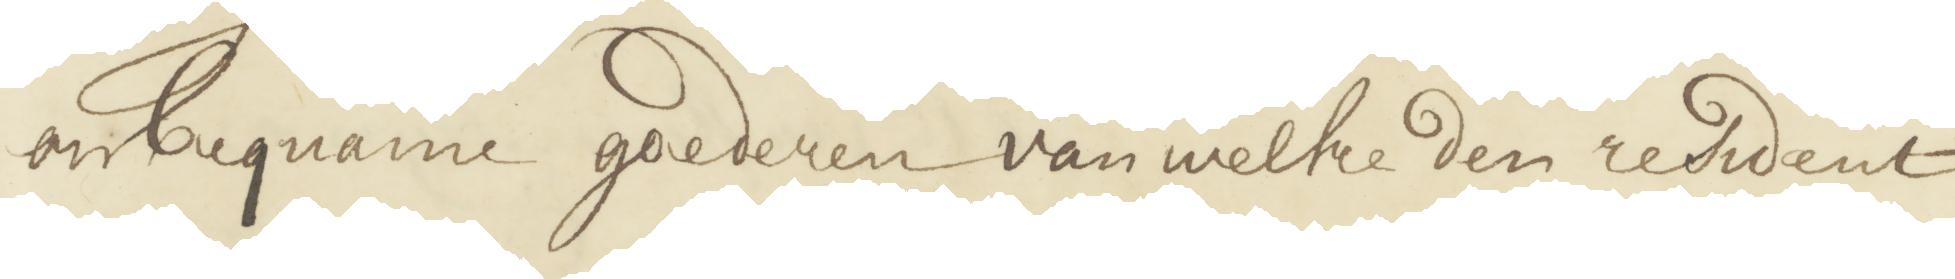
onbequame goederen van welke den resident
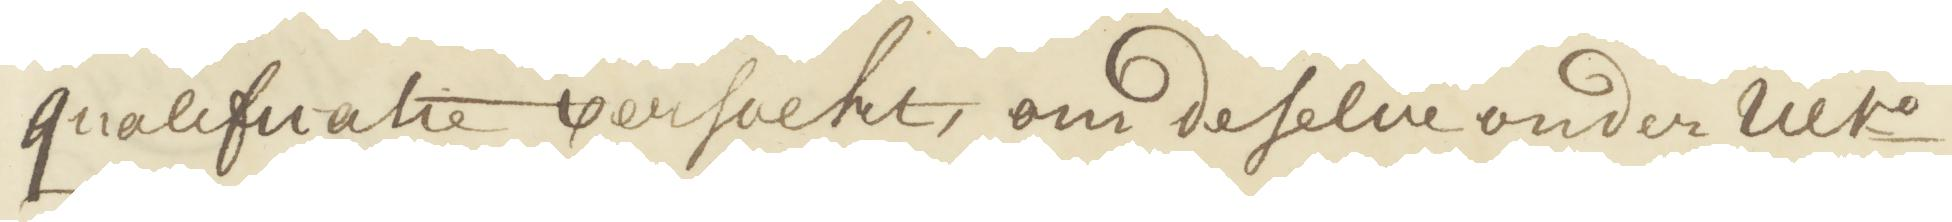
qualificatie versoekt, om deselve onder Ult=o
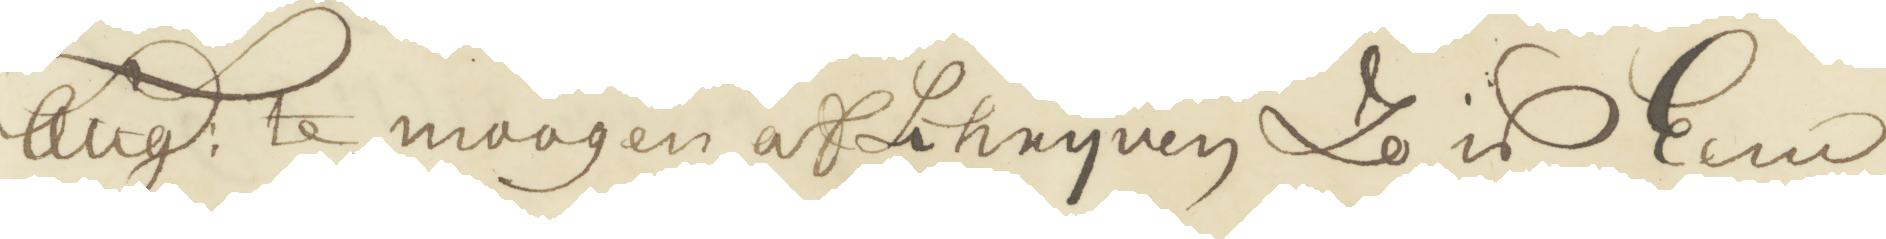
Aug te moogen afchryven Zo is hem
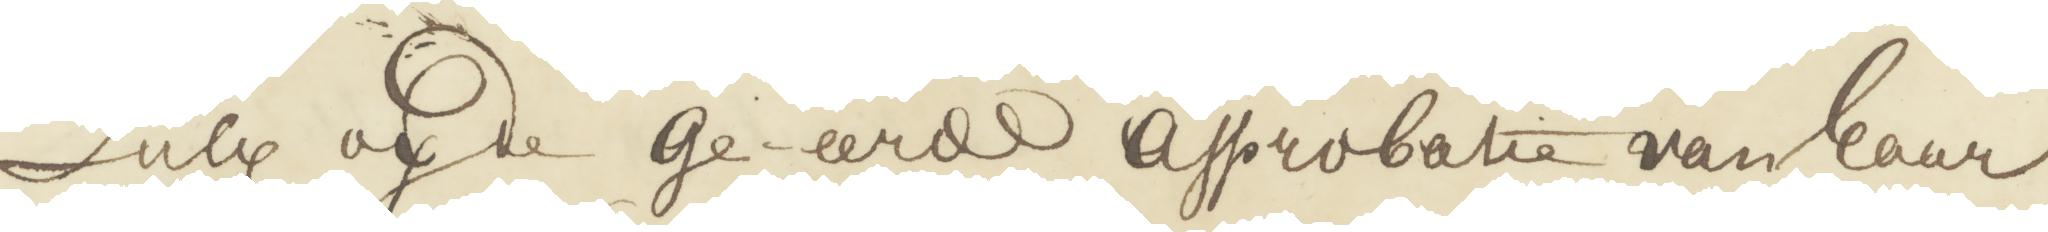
sulx op de ge-eerde approbatie van haar
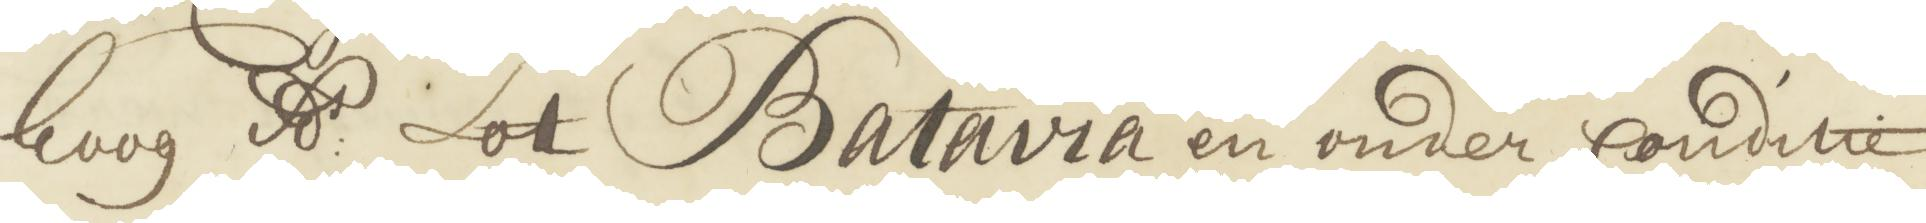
hoog Ed:s tot Batavia en onder conditie
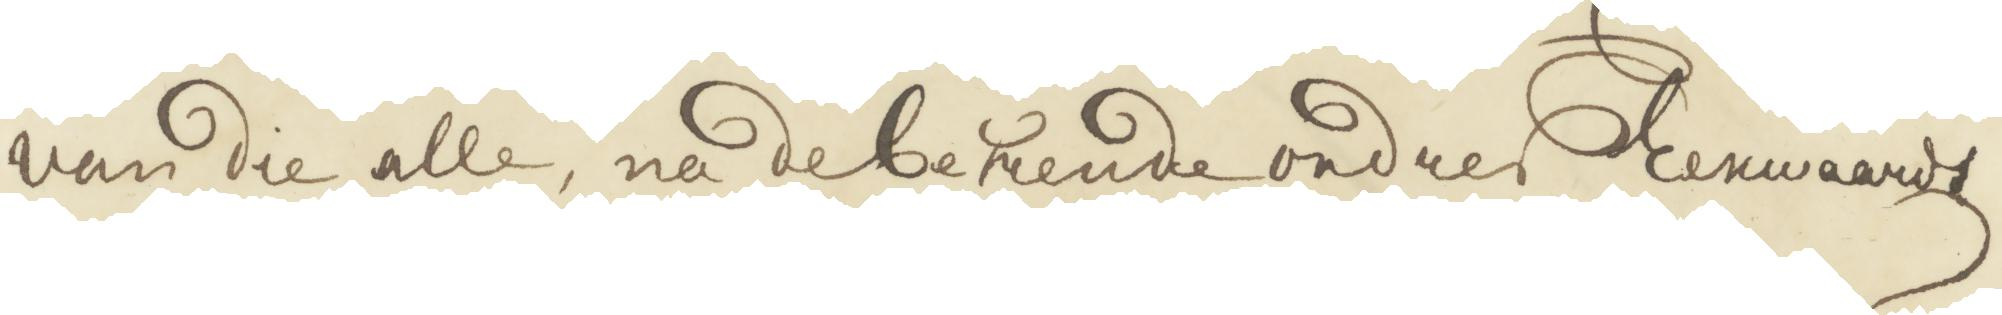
van die alle, na de bekende ordres herwaards
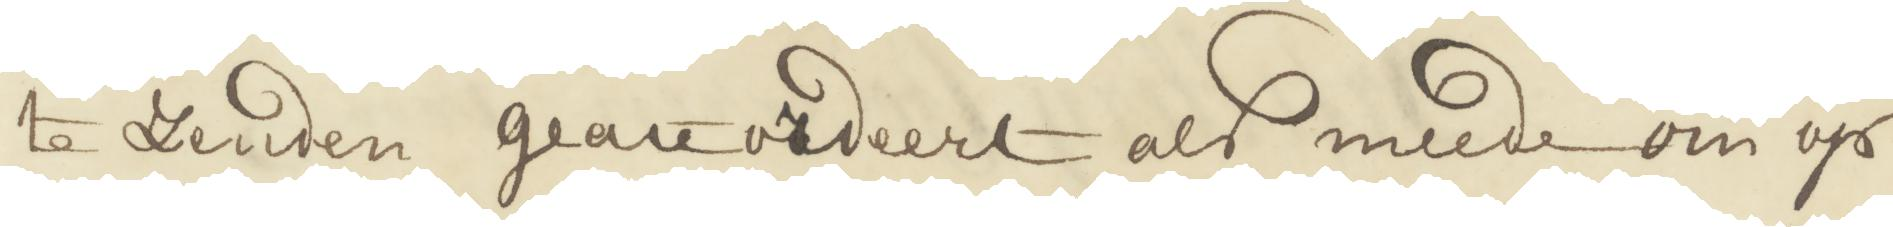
te zenden geaccordeert als meede om op
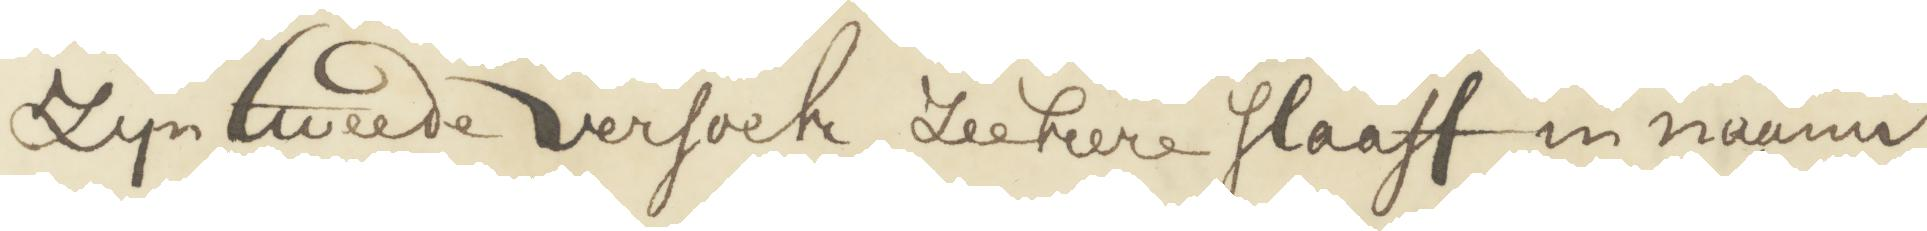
zyn tweede versoek zeekere slaaff in naam
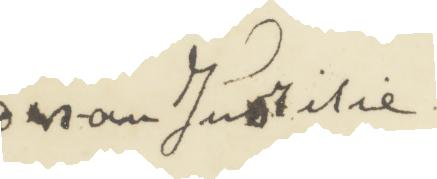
raad van Justitie.
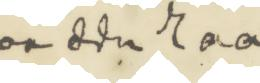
door den
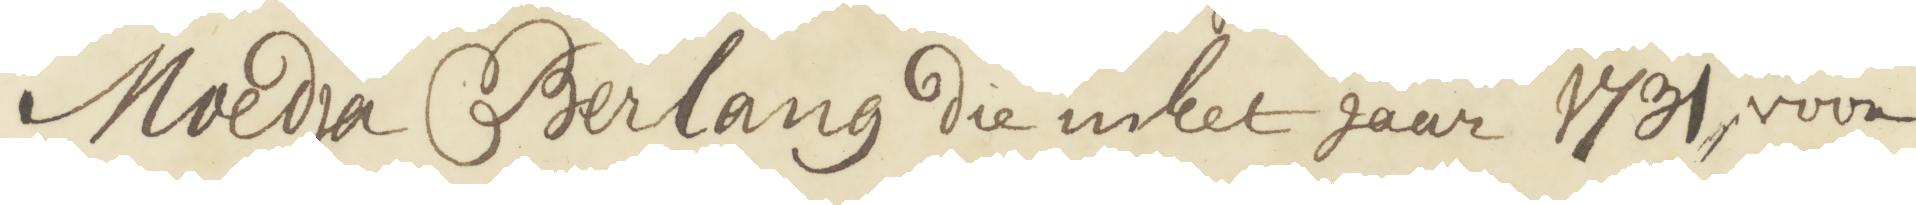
Moedja Berlang die in het jaar 1731„ voor
